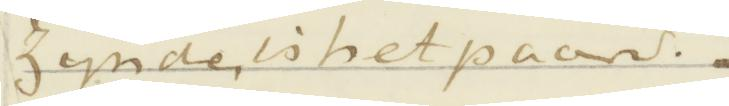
Zynde is het paard.
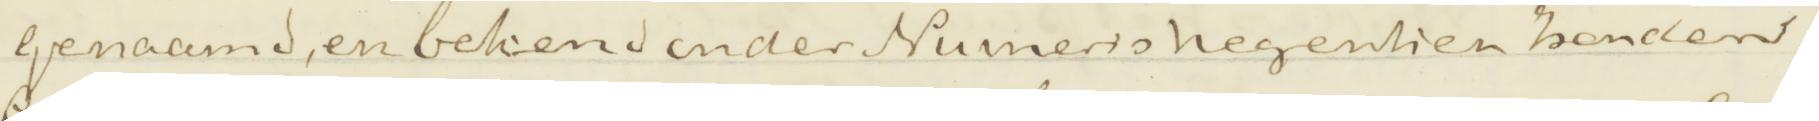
genaamd, en bekend onder Numeris negentien honderd
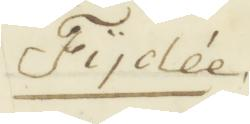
Tijdée
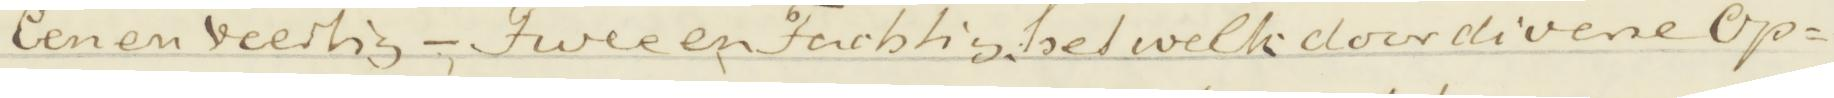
Een en Veertig - Twee en Tachtig het welk door diverse Op=
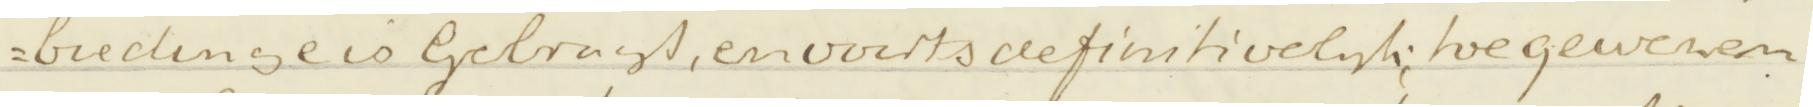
=biedinge is Gebragt, en voorts definitivelyk toe gewezen
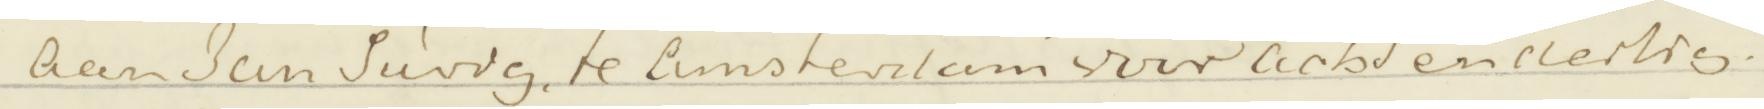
Aan Jan Sureg, te Amsterdam voor acht en dertig
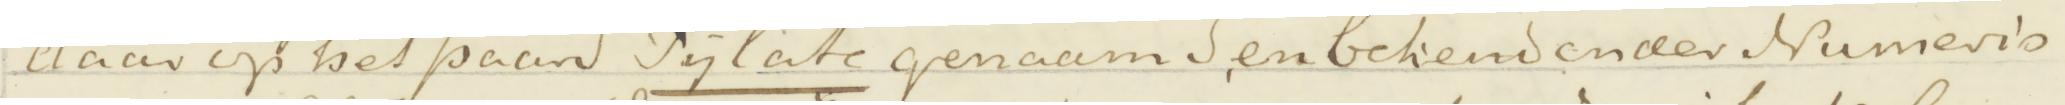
daar op het paard Pijlate genaamd, en bekend onder Numeris
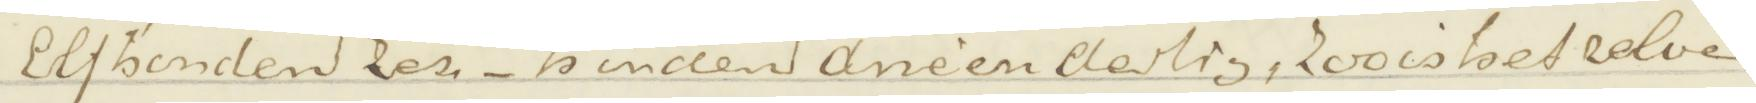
Elfhonderd zes - honderd drie en dertig, zoo is het zelve
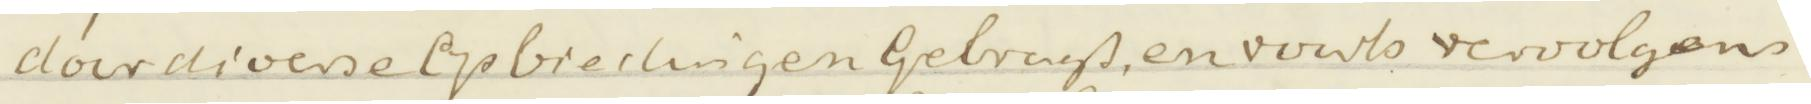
door diverse Opbiedingen Gebragt, en voorts vervolgens
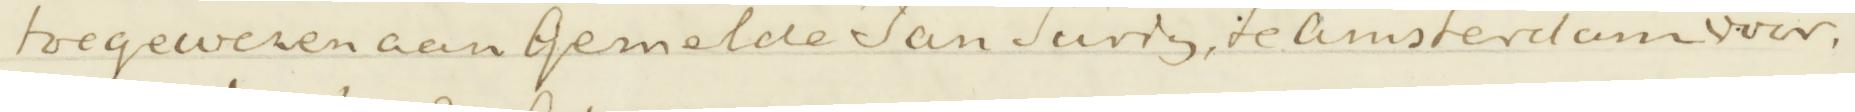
toegewezen aan gemelde Jan Sureg, te Amsterdam voor,
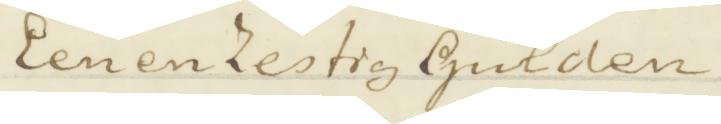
Een en Zestig Gulden
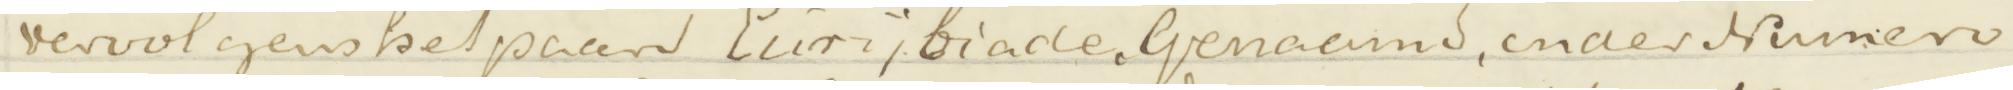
vervolgens het paard Eurijbiade Genaamd, onder Numero
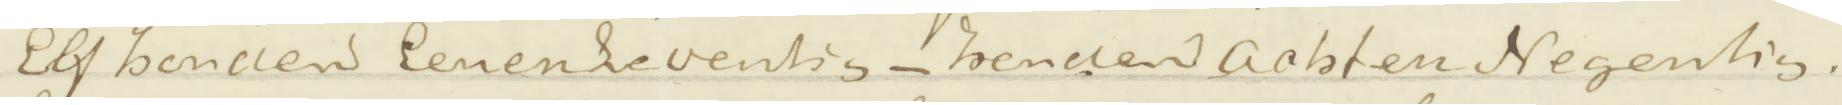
Elf honderd Een en zeventig - honderd acht en Negentig.
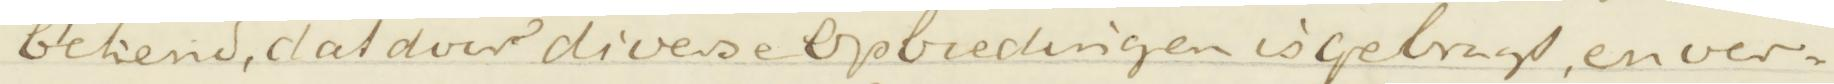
bekend, dat door diverse Opbiedingen is gebragt, en ver=
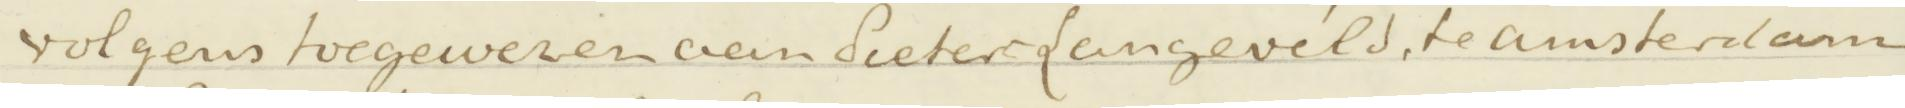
volgens toegewezen aan Pieter Langeveld, te Amsterdam
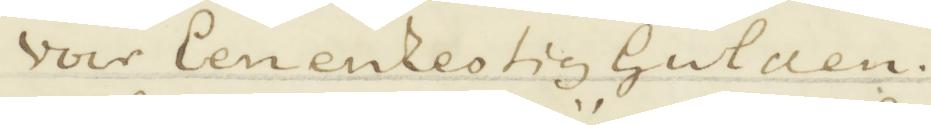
voor Een enZestig Gulden
